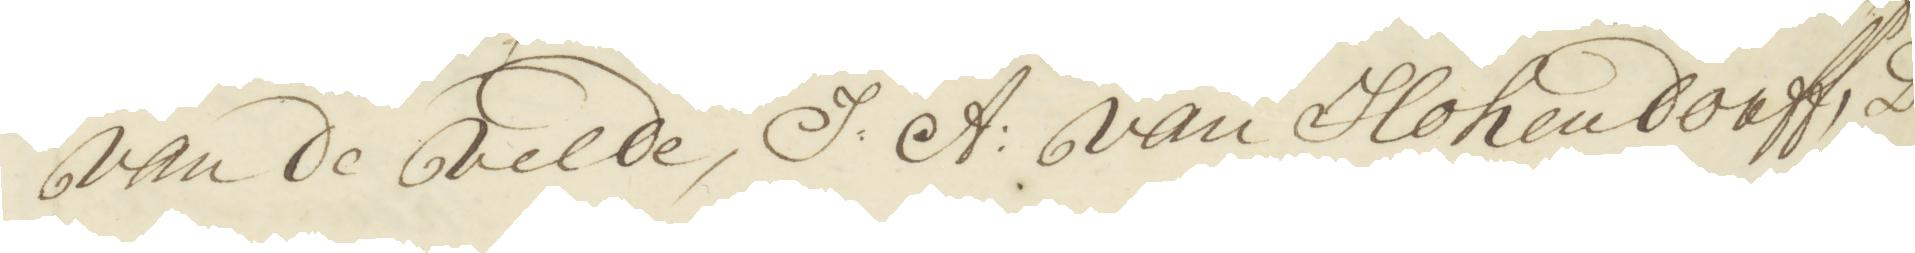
van de velde, J: A: van Hohendorff, D
